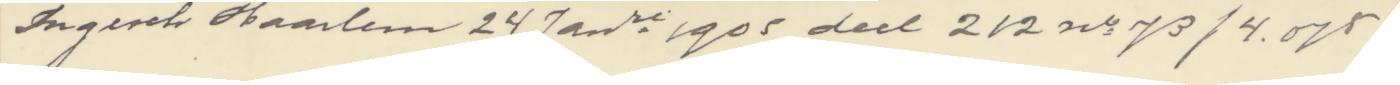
Ingesch Haarlem 27 Jan-ri 1905 deel 212 n=o 73 ƒ 4.075.
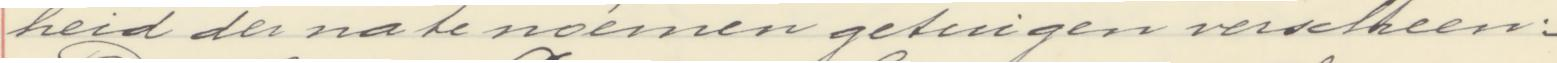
heid der na te noemen getuigen verscheen
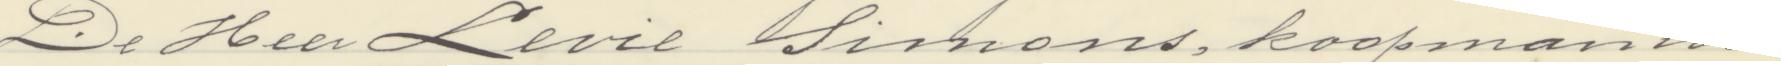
De Heer Levie Simons, koopman wo
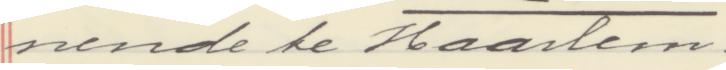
nende te Haarlem
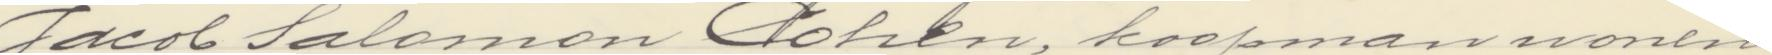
Jacob Salomon Cohen, koopman wonen
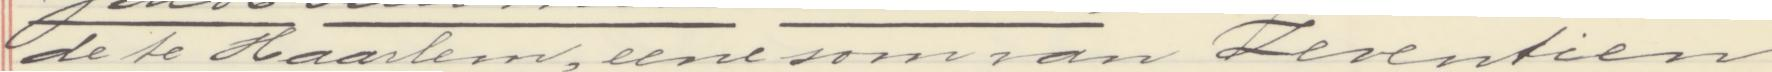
de te Haarlem, eene som van Zeventien
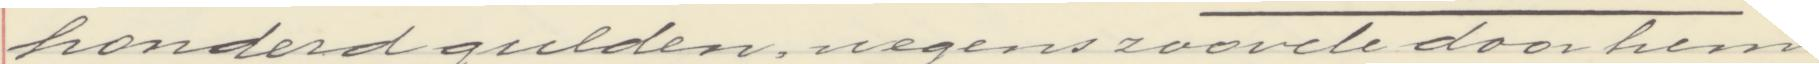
honderd gulden, wegens zoovele door hem
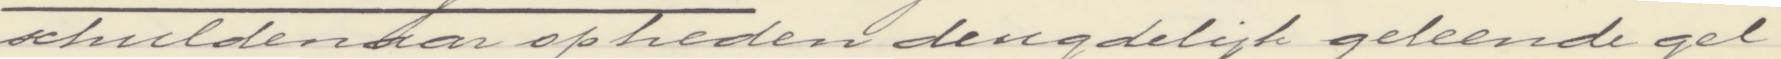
schuldenaar opheden deugdelijk geleende gel
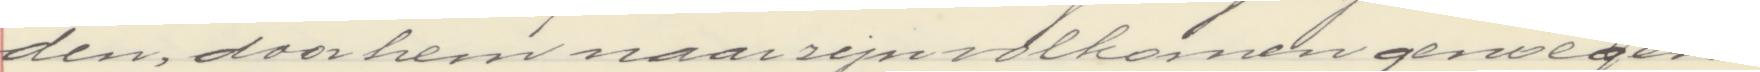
den, door hem naar zijn volkomen genoegen
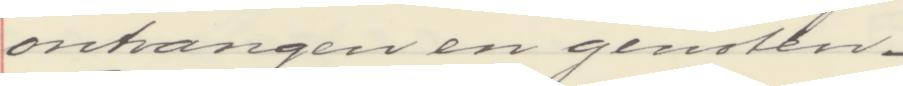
ontvangen en genoten
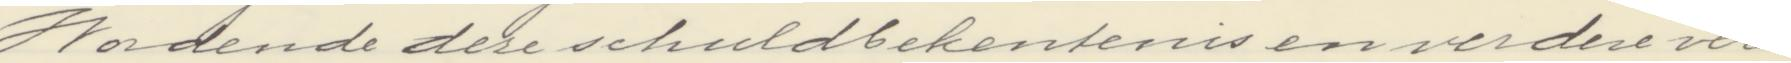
Wordende deze schuldbekentenis en verdere ver
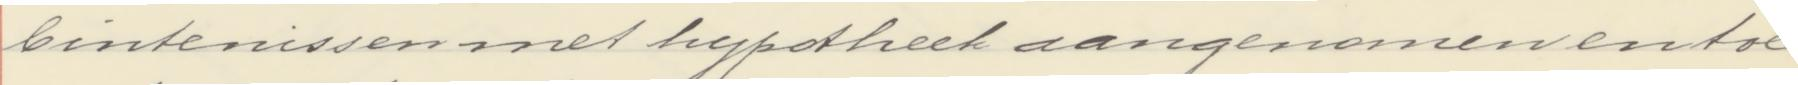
bintenissen met hypotheek aangenomen en toe
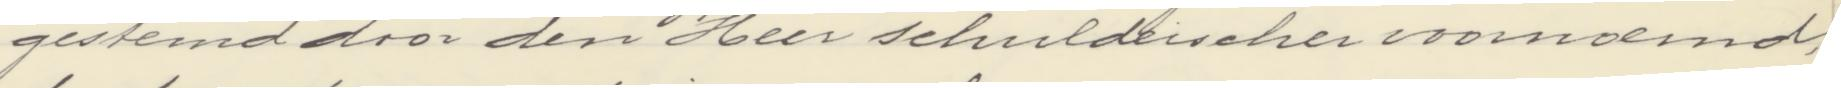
gestemd door den Heer schuldeischer voornoemd,
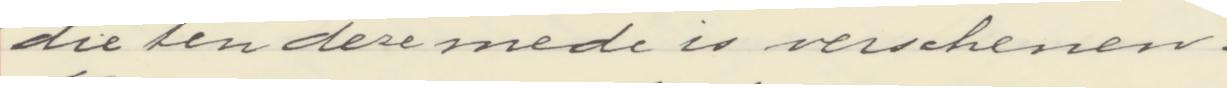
die ten deze mede is verschenen
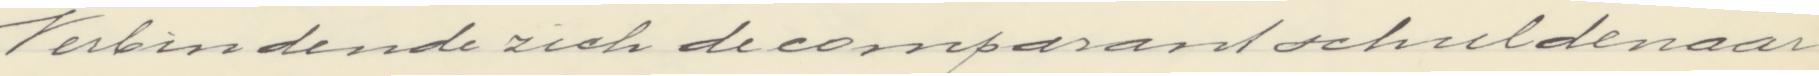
Verbindende zich de comparant schuldenaar
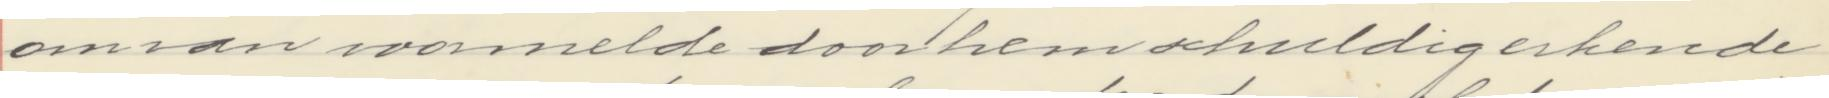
om van voormelde door hem schuldig erkende
